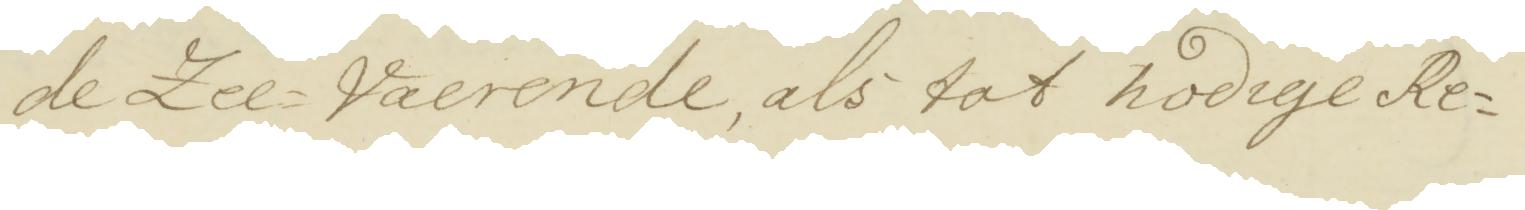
de zee=vaerende, als tot nodige Re„
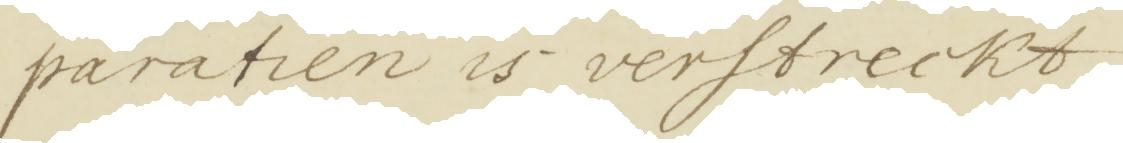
paratien is verstreckt.
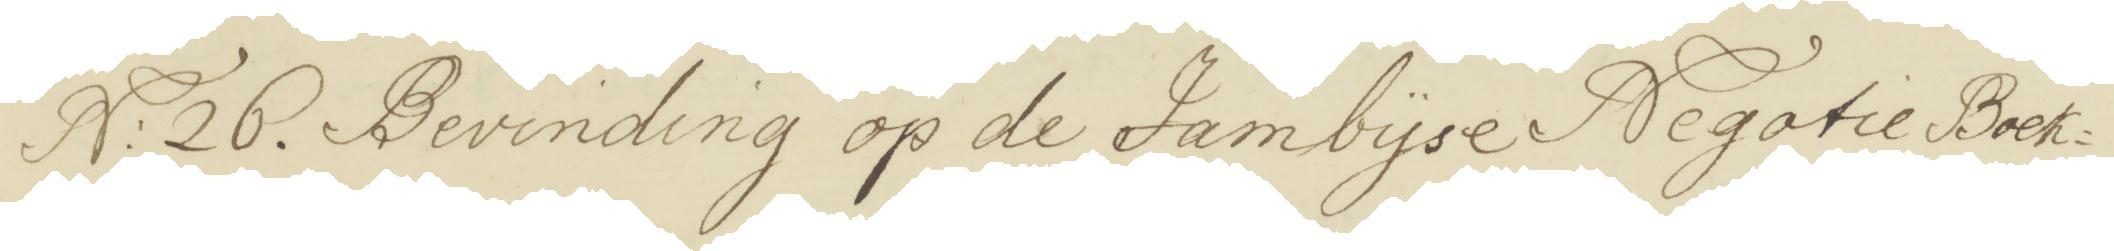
N: 26. Bevinding op de Iambijse Negotie Boek„
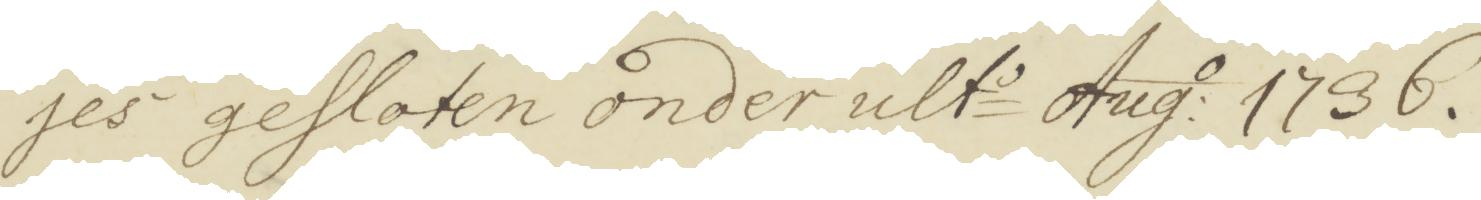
jes gesloten onder ult=o Aug:o 1736.
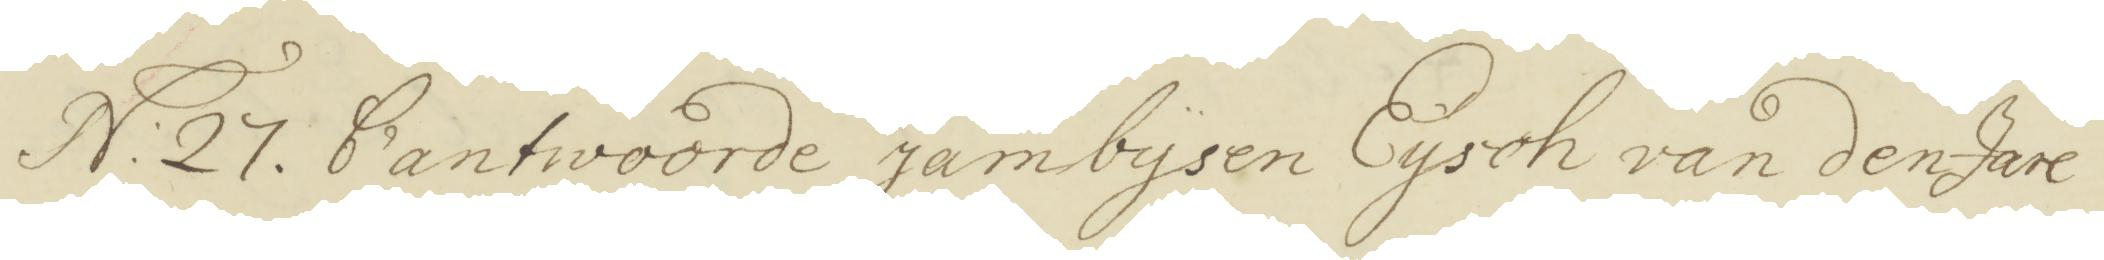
N: 27. b'antwoorde jambijsen Eijsch van den Jare
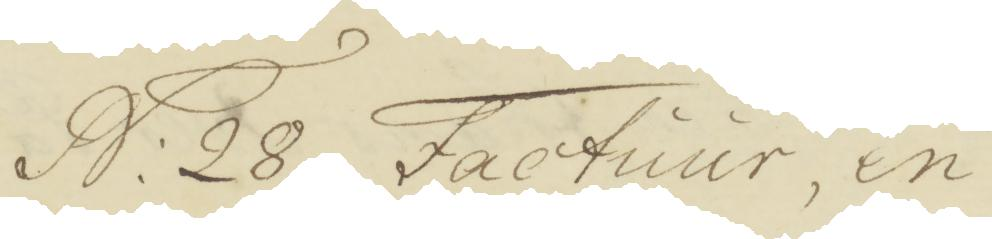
N: 28. Factuur, en
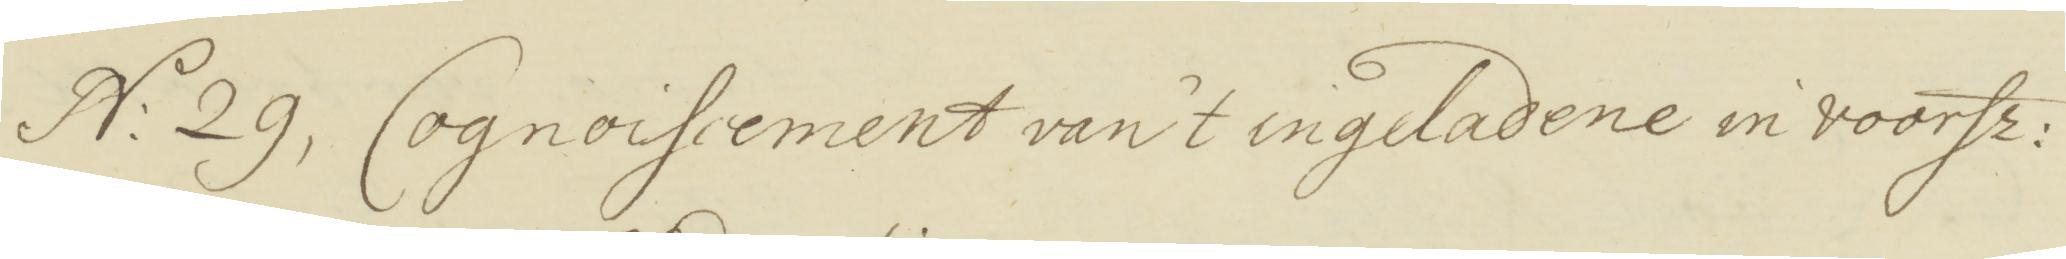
N: 29, Cognoiscement van ’t ingeladene in voorsz:
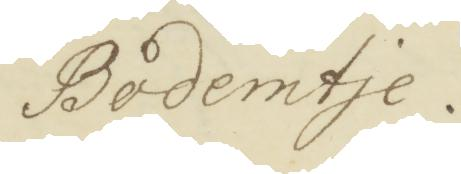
Bodemtje.
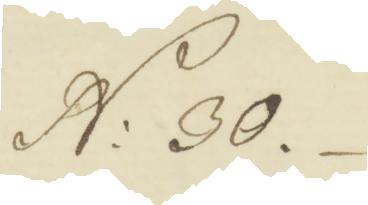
N: 30. —
